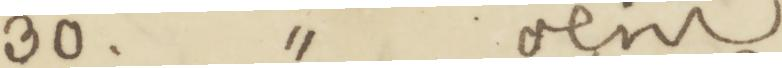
30. „ olie
